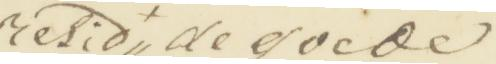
resid„t de goede
